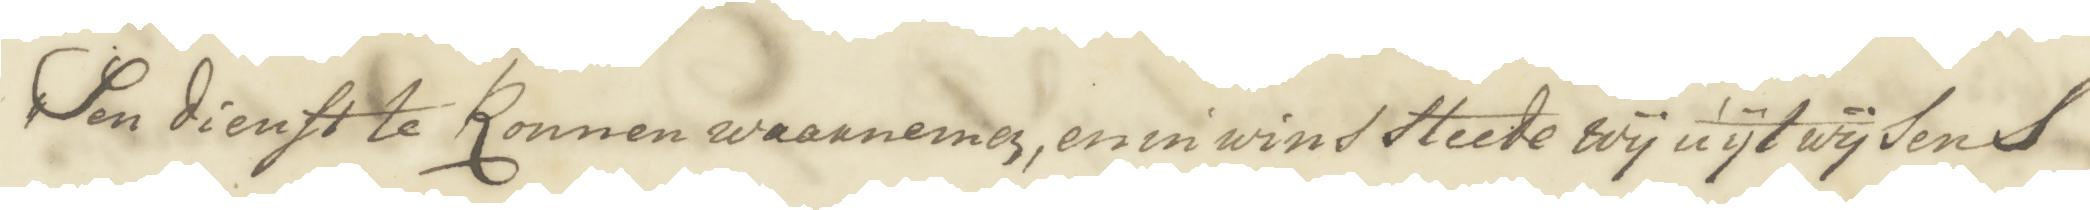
„sen dienst te konnen waarnemen, en in wins steede wij uijtwijsens
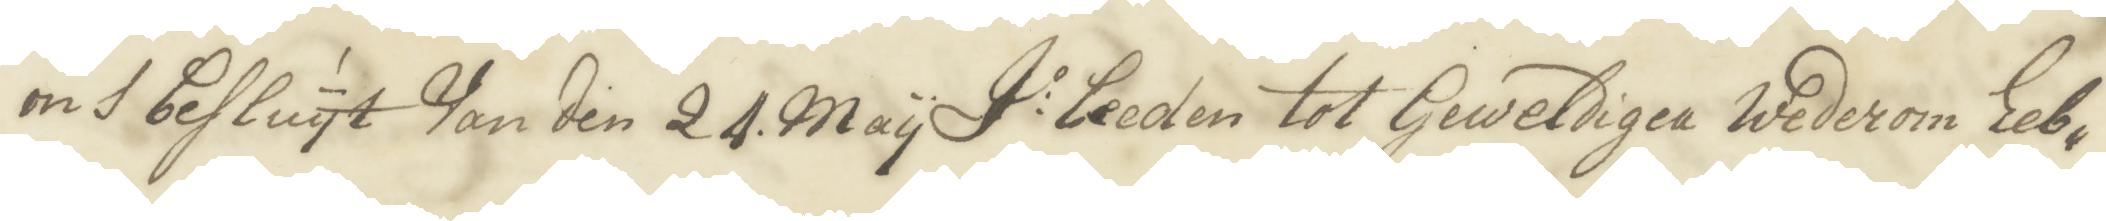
ons besluijt van den 24. maij I:o leeden tot Geweldiger wederom heb„
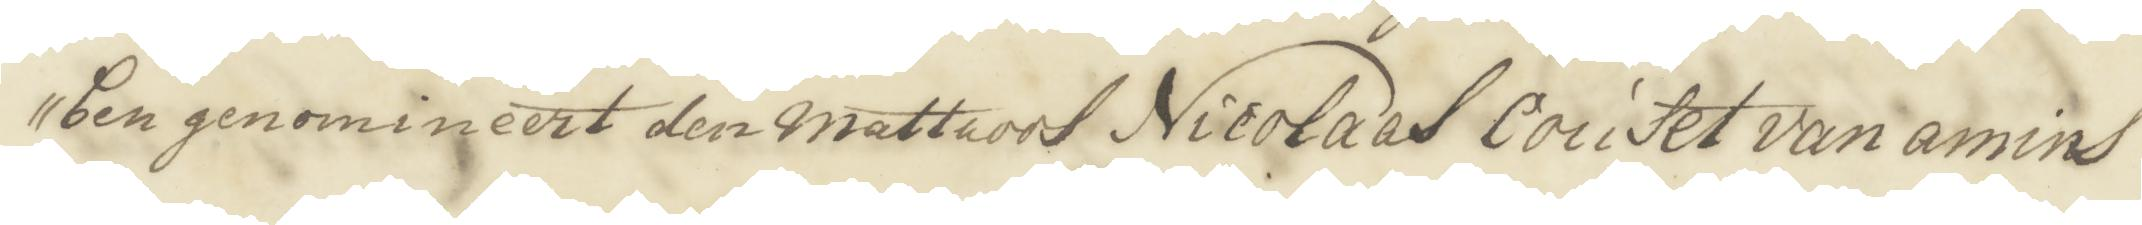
„ben genomineert den mattroos Nicolaas Couset van amins
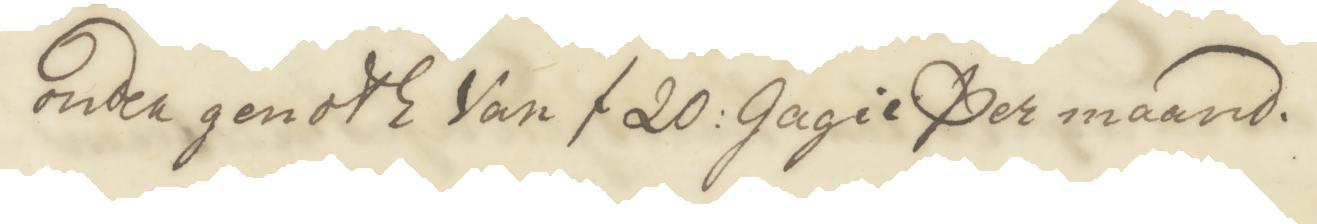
onder genoth van ƒ 20: gagie per maand.
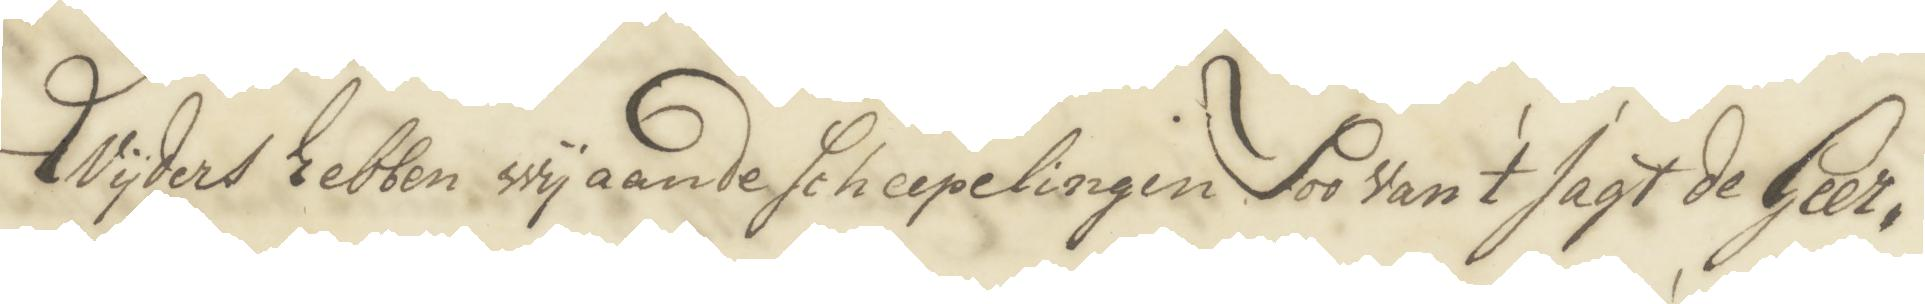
Wijders hebben wij aan de scheepelingen Soo van ’t Jagt de Geer„
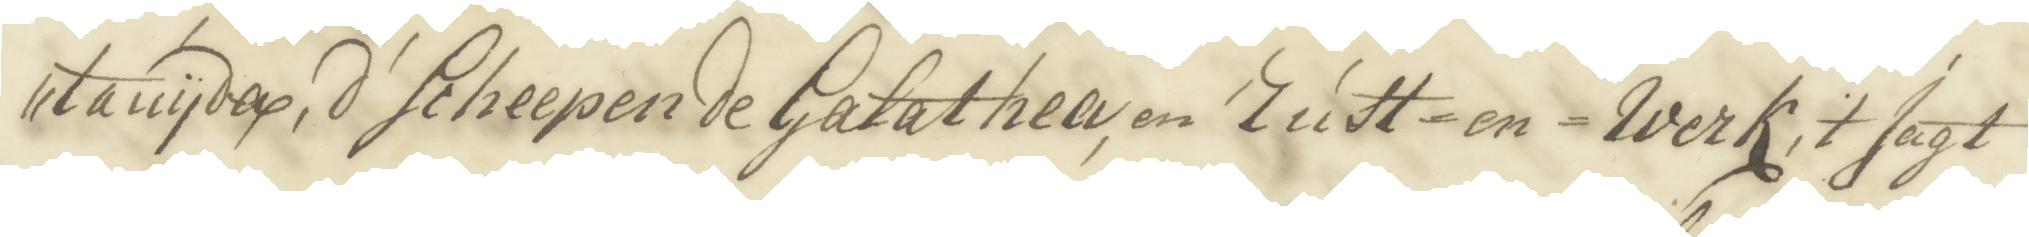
„truijda, d’ scheepen de Galathea, en rust=en=werk, ’t Jagt
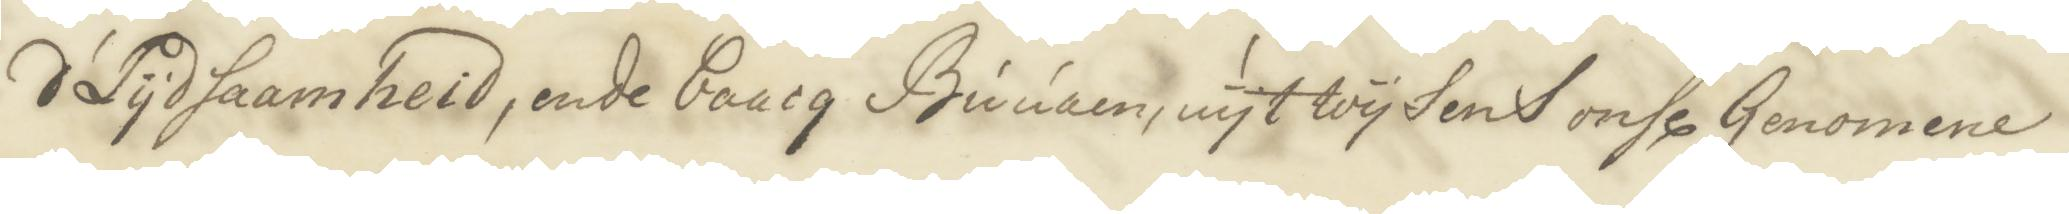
d’Lijdsaamheid, ende barcq Buuren, uijt wijsens onse Genomene
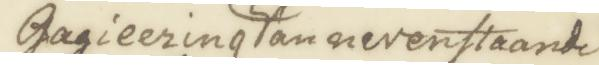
Gagieering van nevenstaande
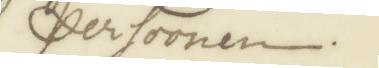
persoonen.
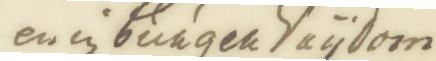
en in burger Vrijdom
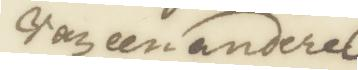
van een andere
